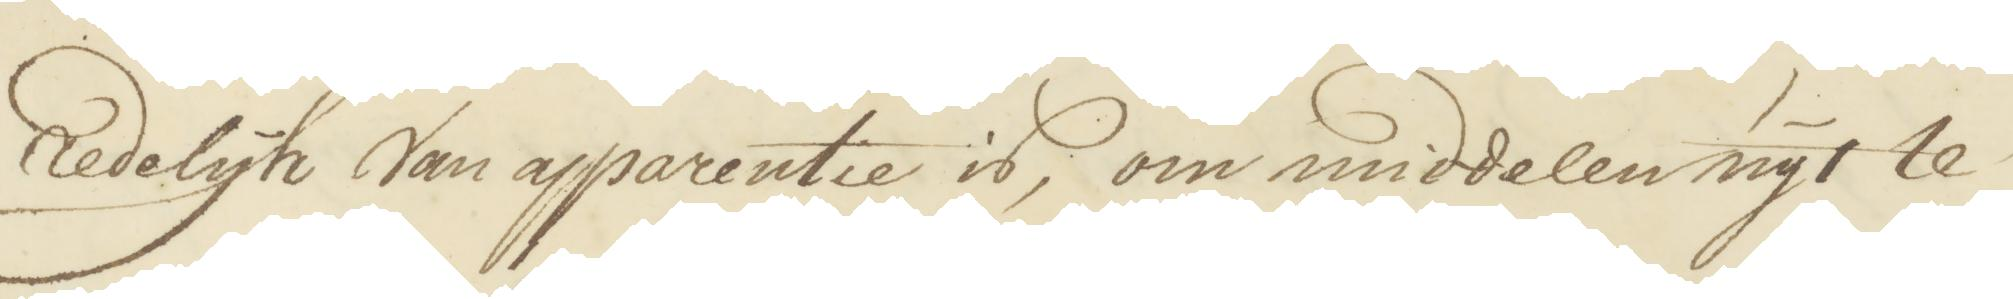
redelijk Van apparentie is, om middelen uijt te
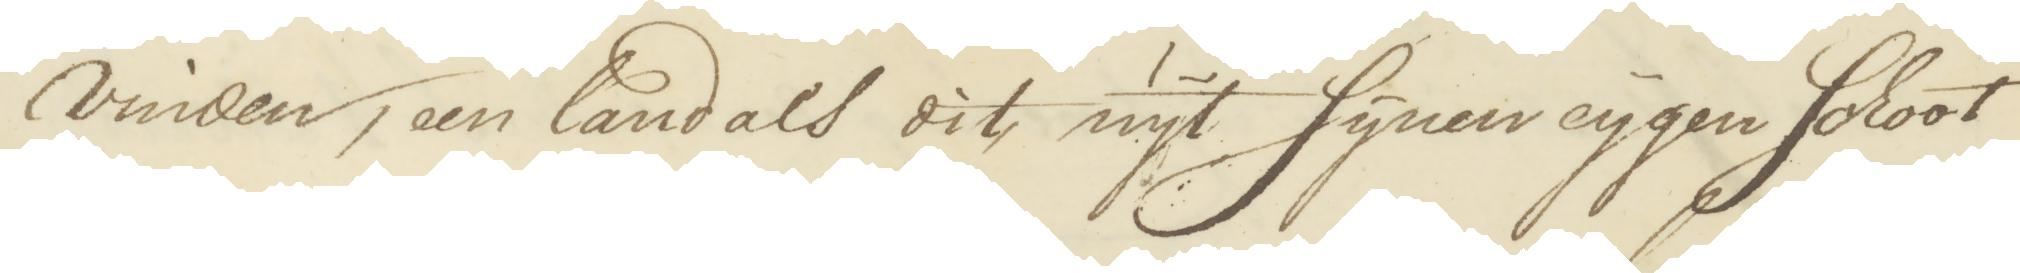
vinden, een land als dit uijt sijnen eijgen schoot
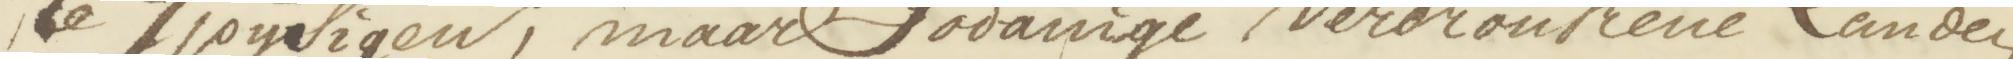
te spijsigen; maar sodanige verdronkene Landen
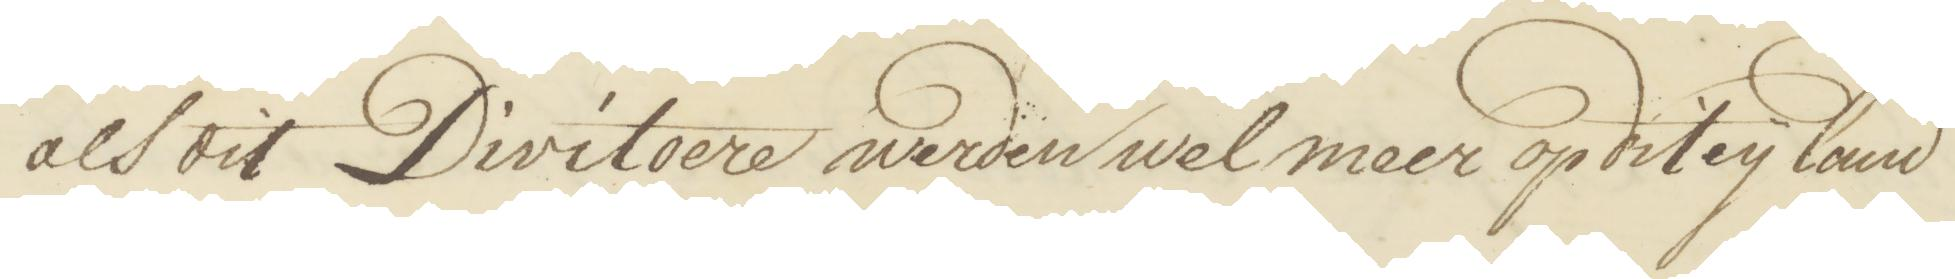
als dit Divitoere werden wel meer op dit eijland
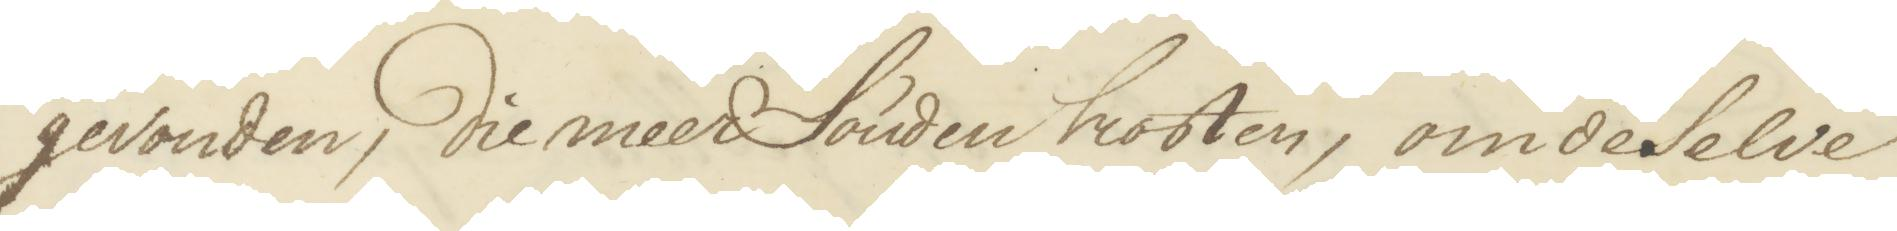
gevonden, die meer souden kosten, om deselve
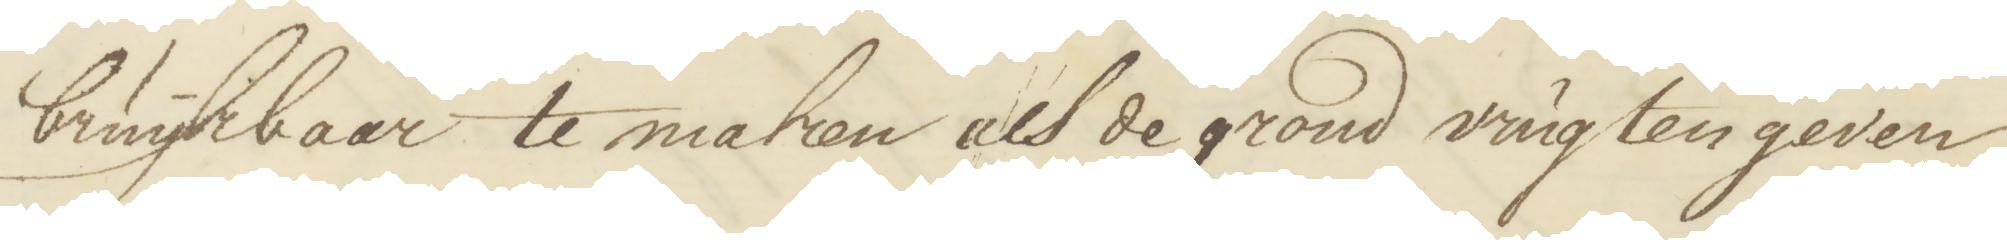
bruijkbaar te maken als de grond vrugten geven
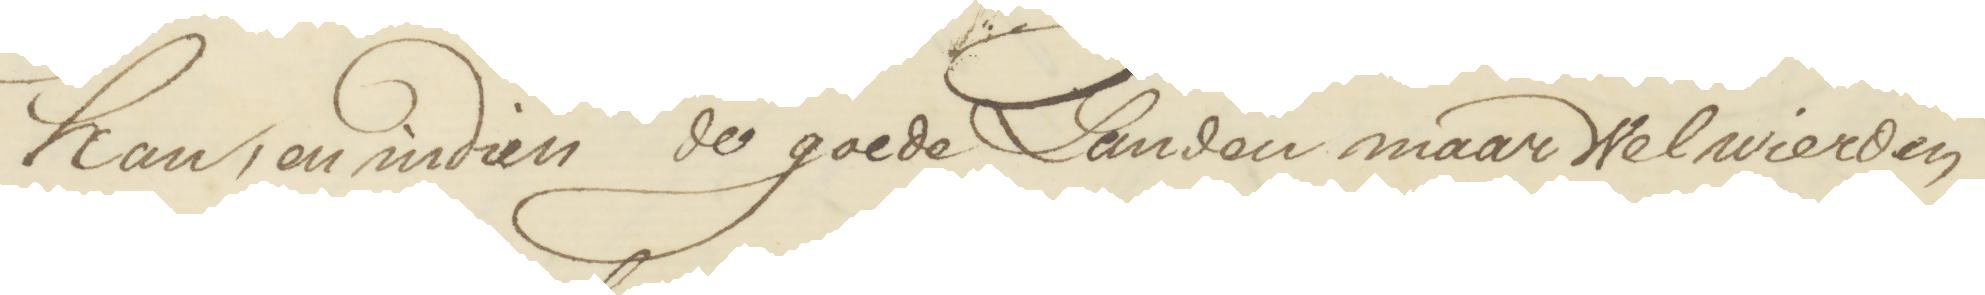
kan, en indien de goede Landen maar Wel wierden
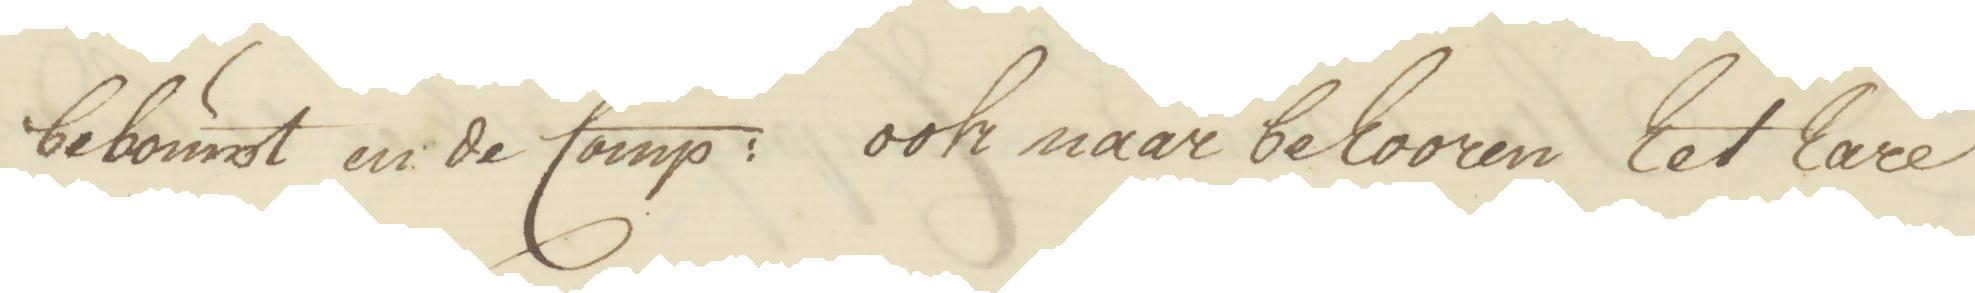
bebouwt en de Comp: ook naar behooren het hare
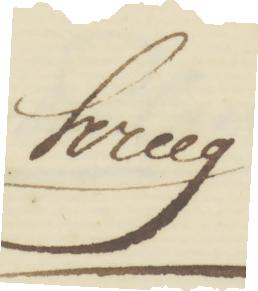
kreeg
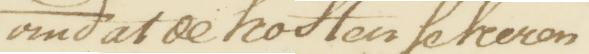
omdat de kosten sekeren
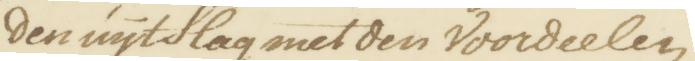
den uijtslag met den Voordeelen
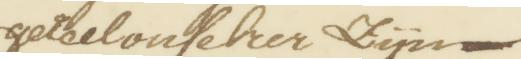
geheel onseker zijn —
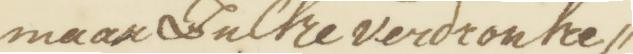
maar zulke verdronke„
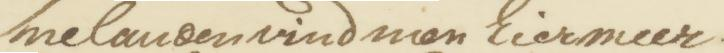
nelanden vind men hiermeer.
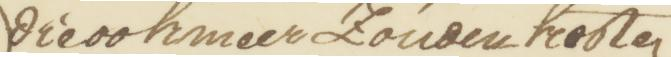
dieookmeer zouden kosten
